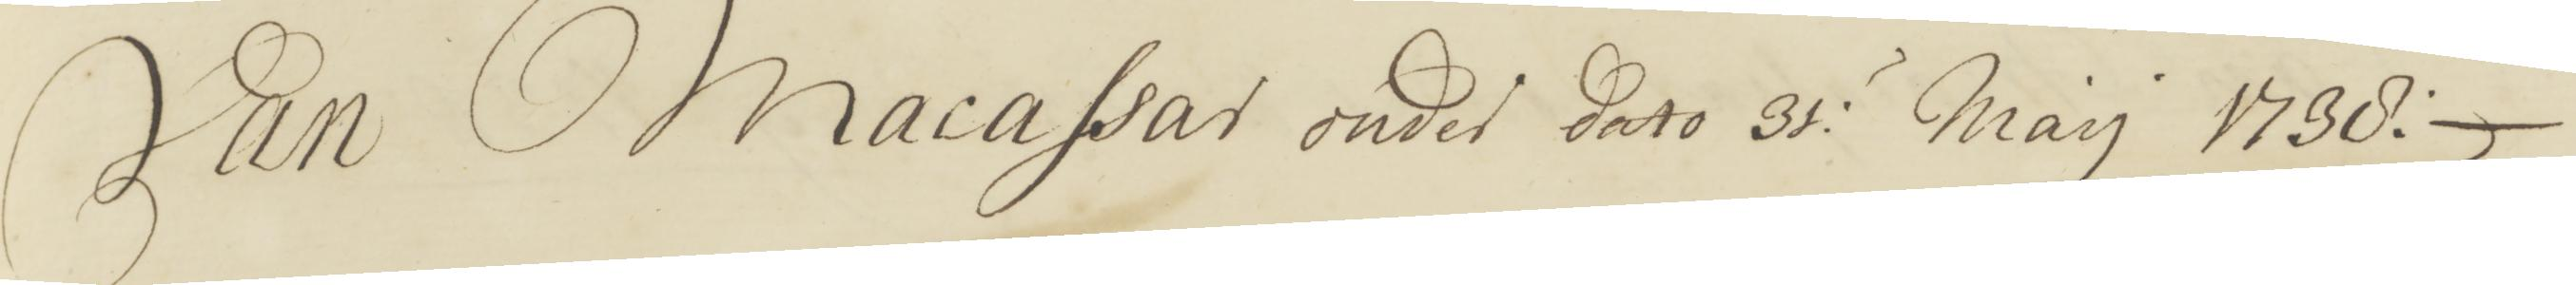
Van Macassar onder dato 31:' Maij 1738: —
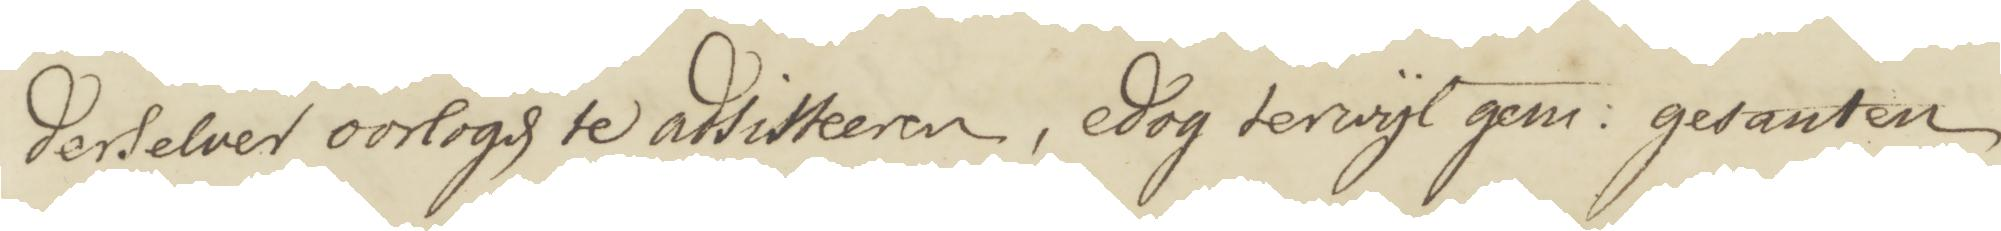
derselver oorlogen te adsisteeren, edog terwijl gem: gesanten
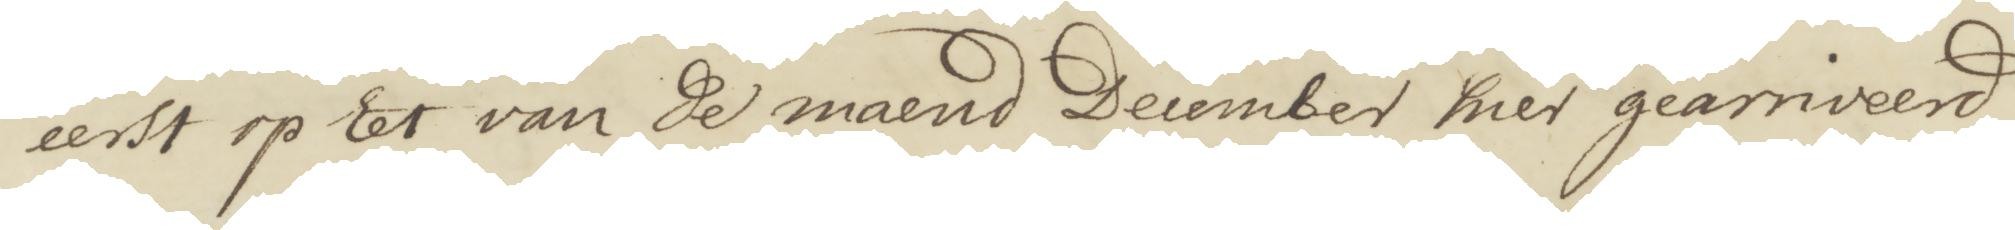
eerst op het van de maend December hier gearriveerd
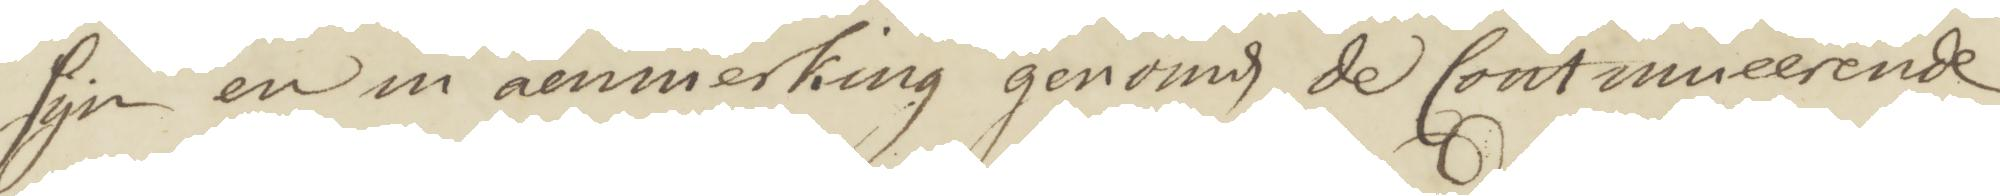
sijn en in aenmerking genomen de Continueerende
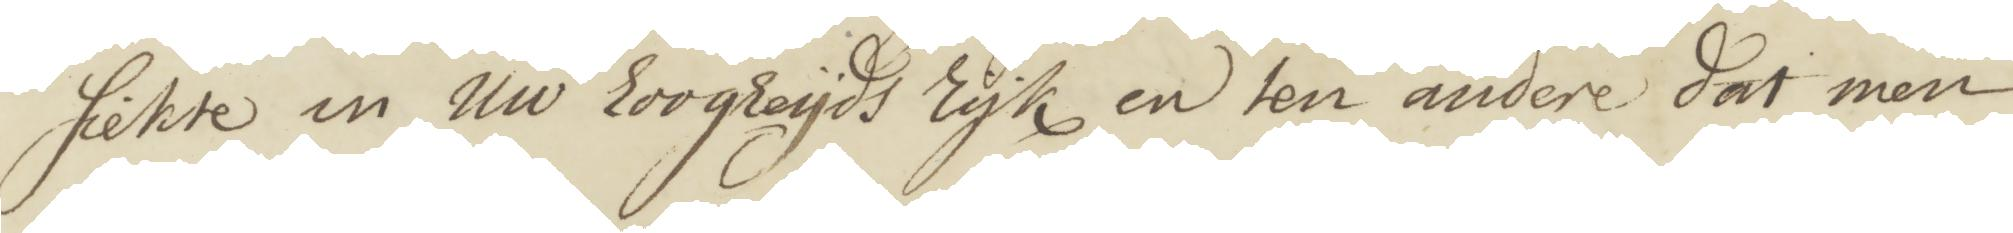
siekte in uw hoogheijds rijk en ten andere dat men
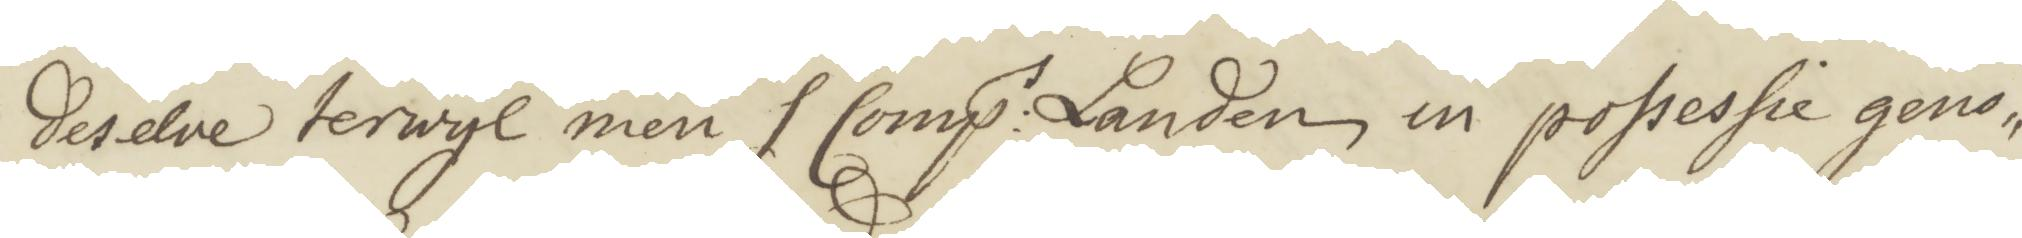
deselve terwijl men 's Comp:s Landen in possessie geno„
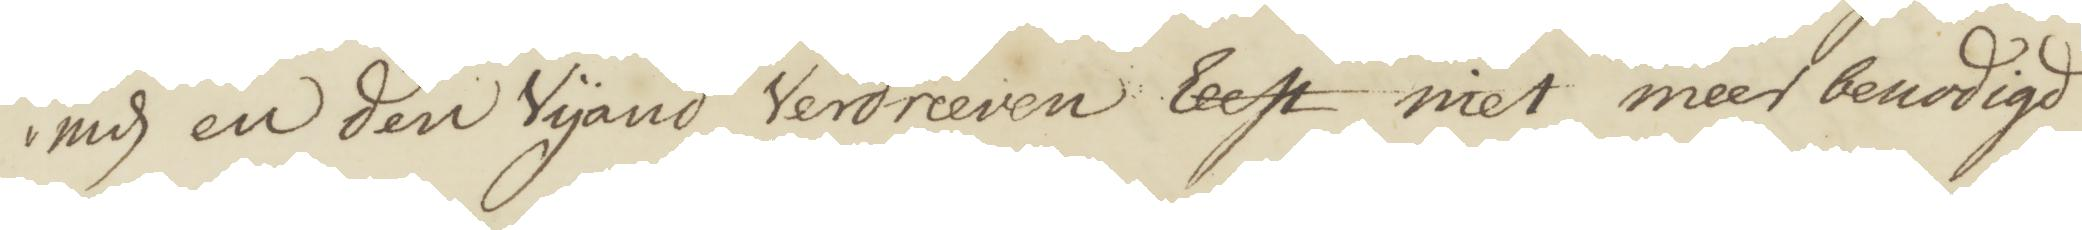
„men en den vijand verdreeven heeft niet meer benodigd
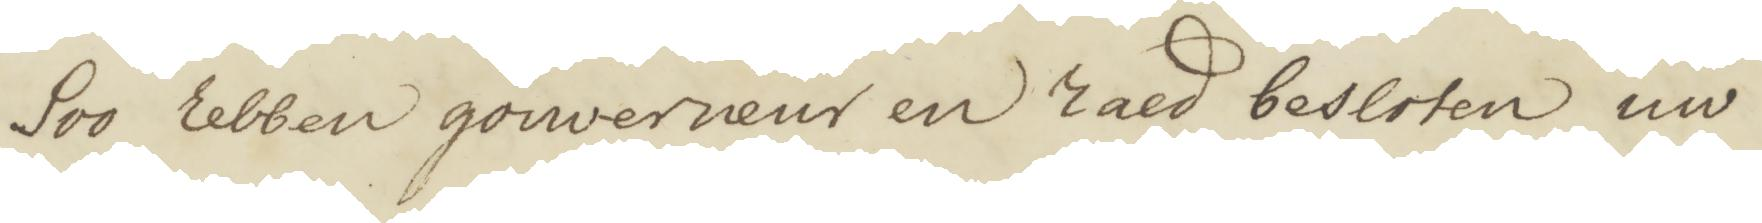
soo hebben gouverneur en raed besloten uw
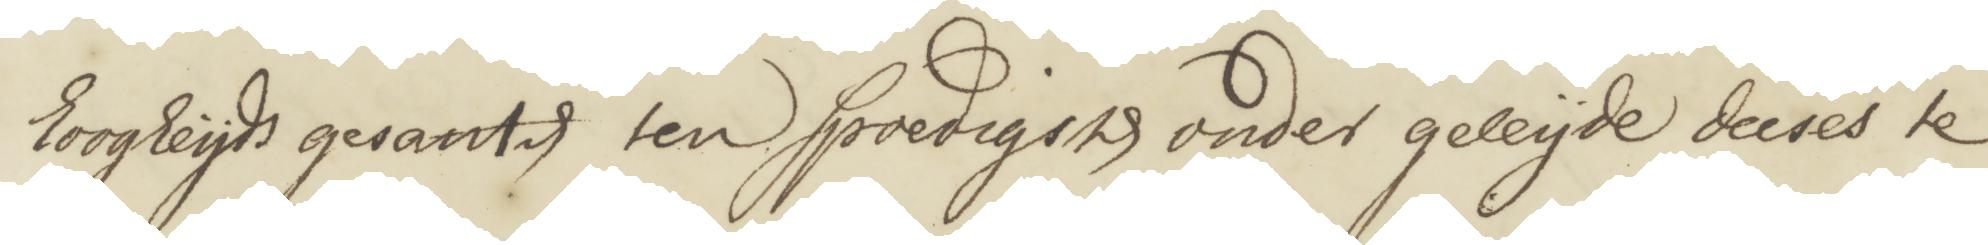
hoogheijds gesanten ten spoedigsten onder geleijde deeses te
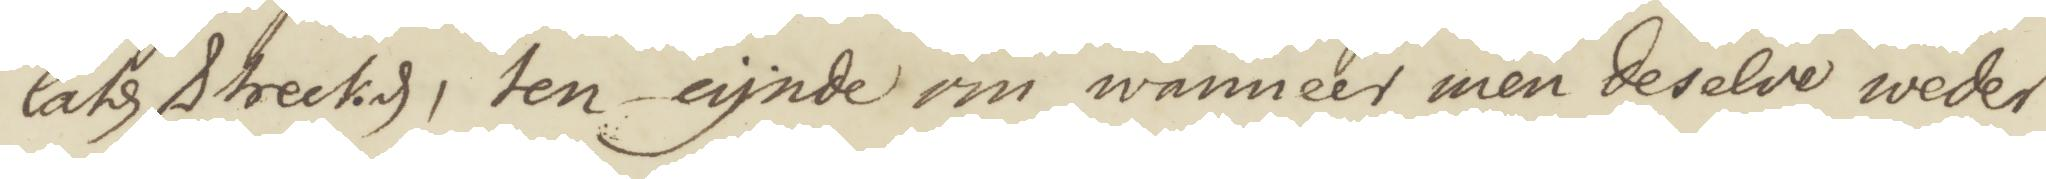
laten vertrecken, ten eijnde om wanneer men deselve weder
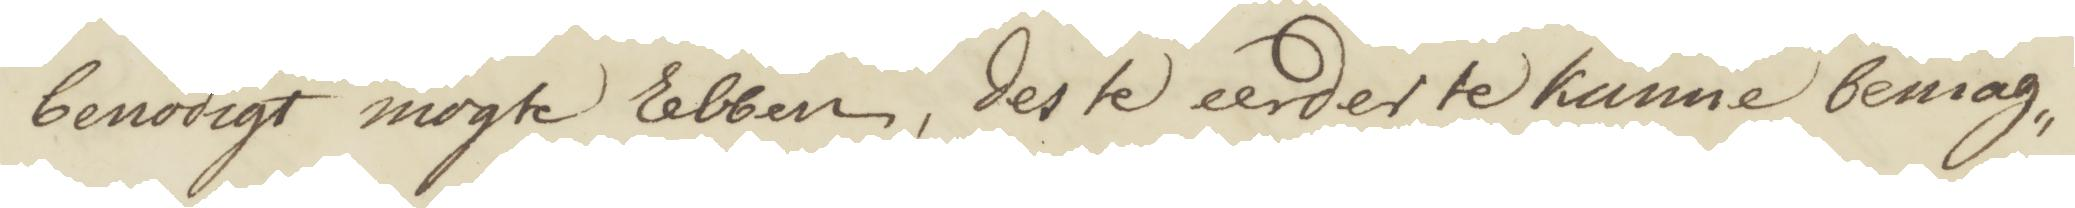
benodigt mogte hebben, des te eerder te kunne bemag„
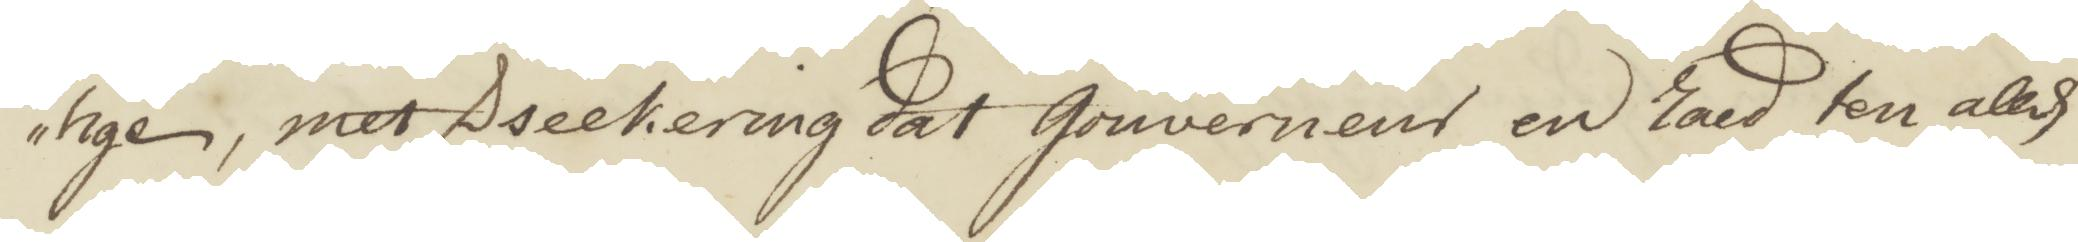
„tigen met verseekering dat gouverneur en raed ten allen
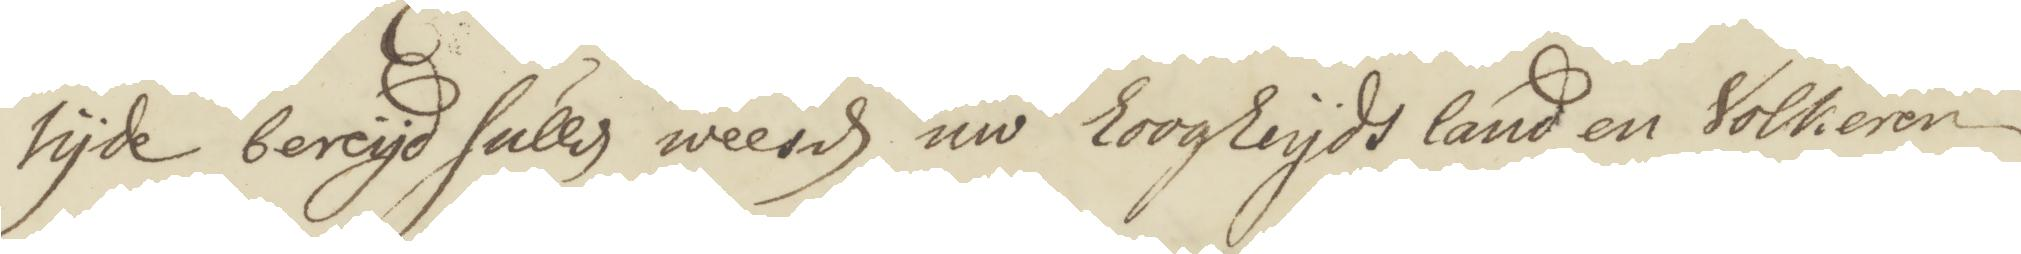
tijde bereijd sullen weesen uw hoogheijds land en volkeren
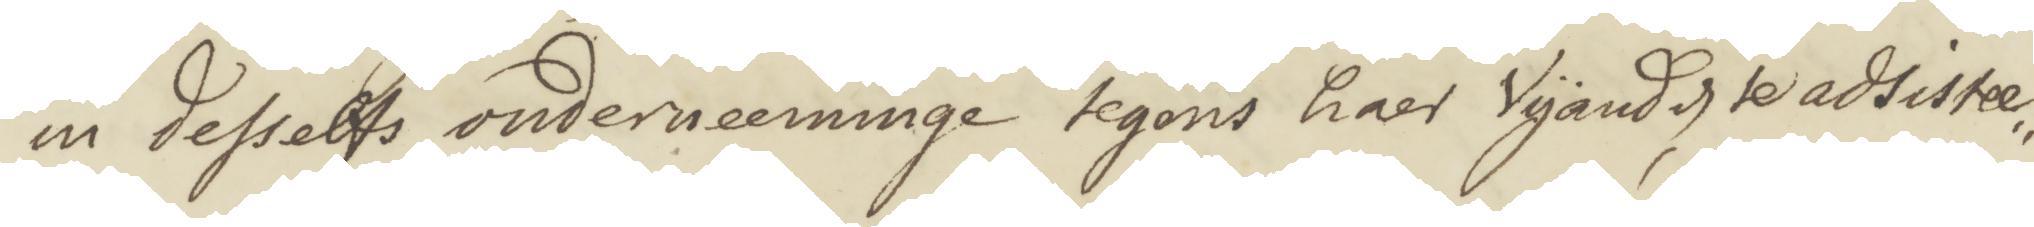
in desselfs onderneeminge tegens haer vijanden te adsistee„
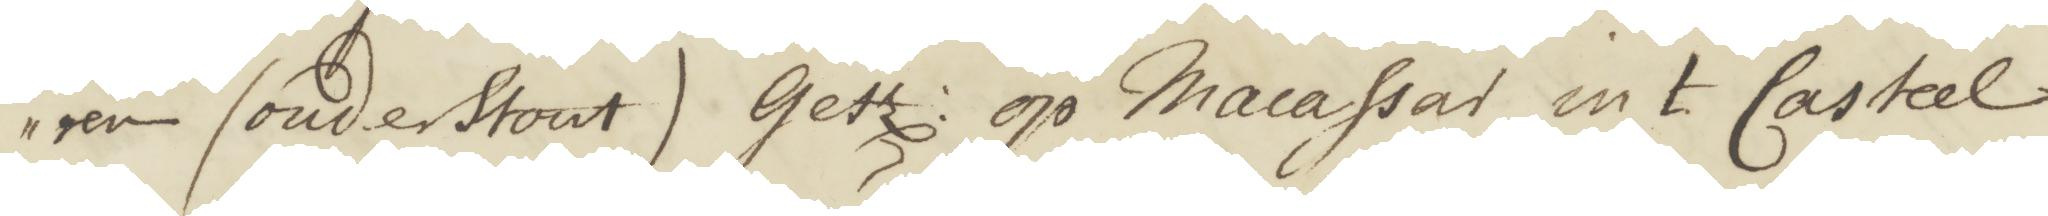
„ren (onderstont) gesz: op Macassar in ’t Casteel
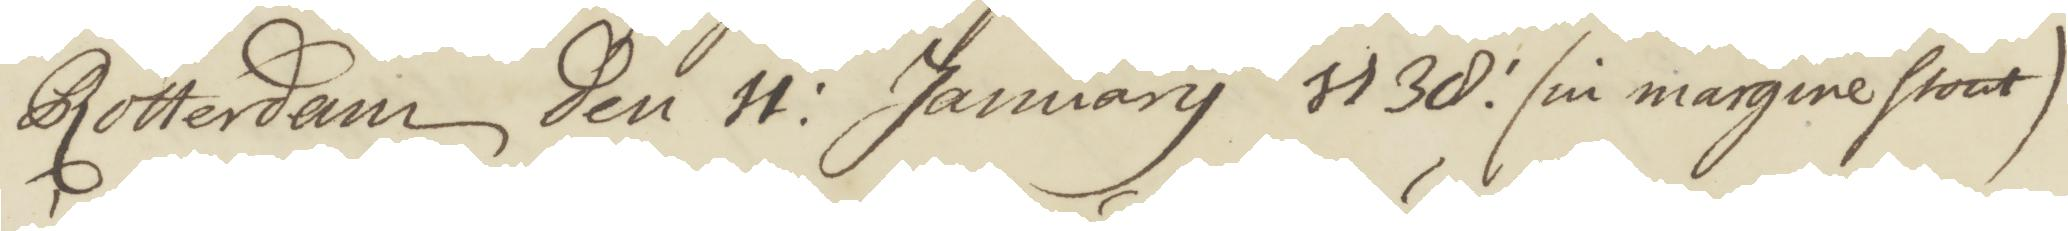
Rotterdam den 11:' Januarij 1738: (in margine stont)
